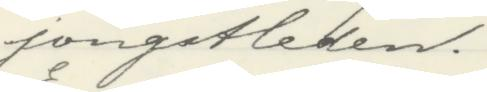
jongstleden.
